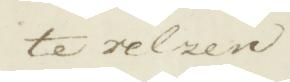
te velzen
